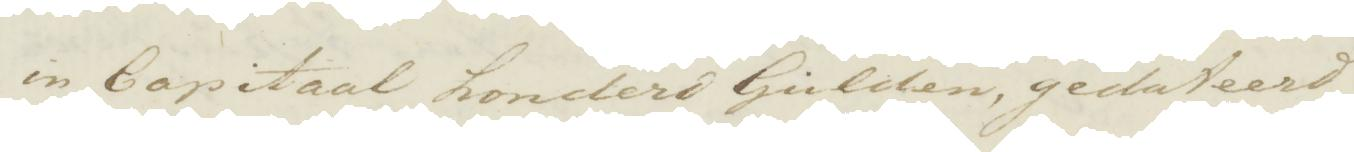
in Capitaal honderd Gulden, gedateerd
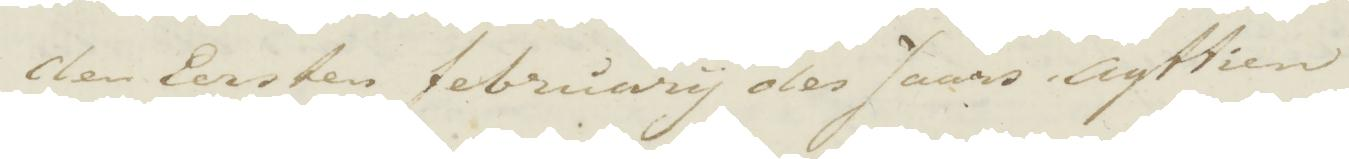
den Eersten Februarij des Jaars, Agttien
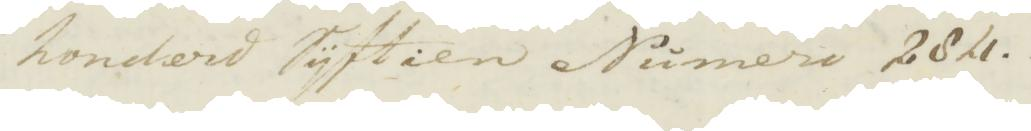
honderd Vijftien Numero 284.
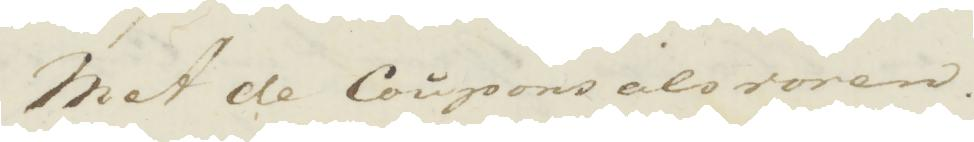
Met de Coupons als voren.
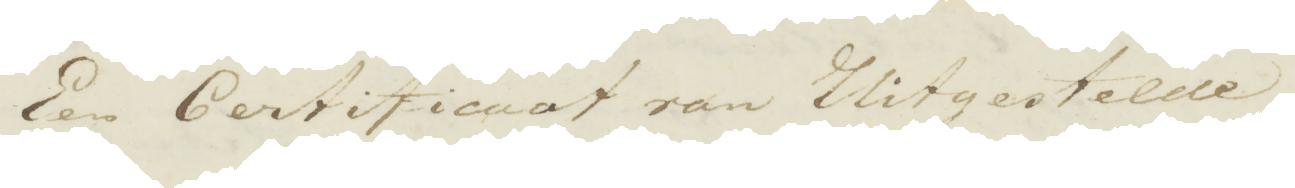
Een Certificaat van Uitgestelde
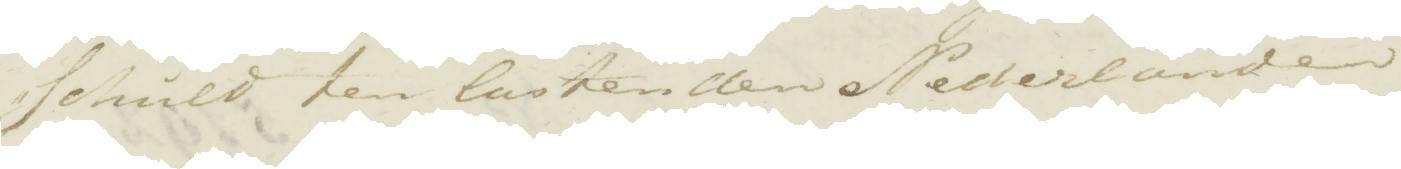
„schuld ten lasten den Nederlanden
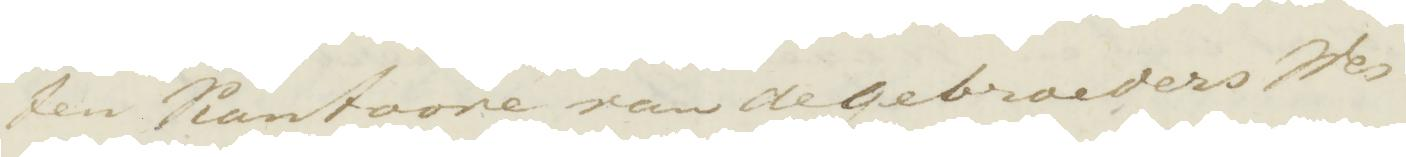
ten Kantoore van de gebroeders Wes
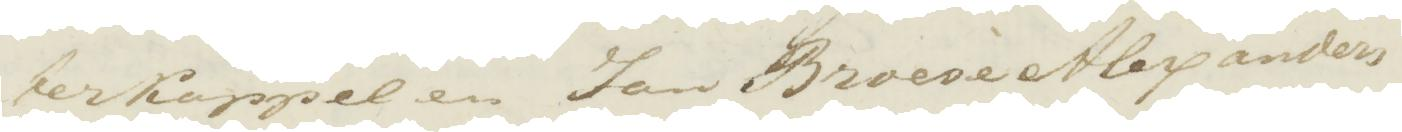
terkappel en Jan Broese Alexanders
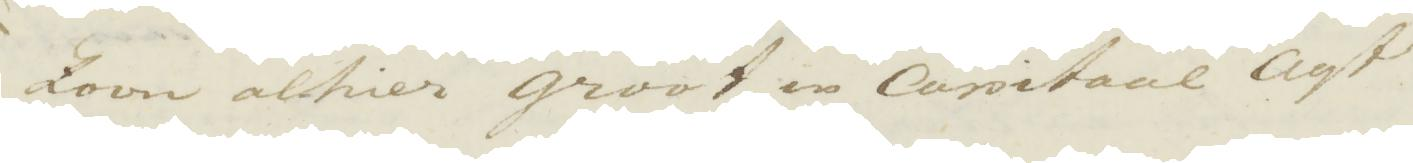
Zoon alhier groot in Capitaal Agt
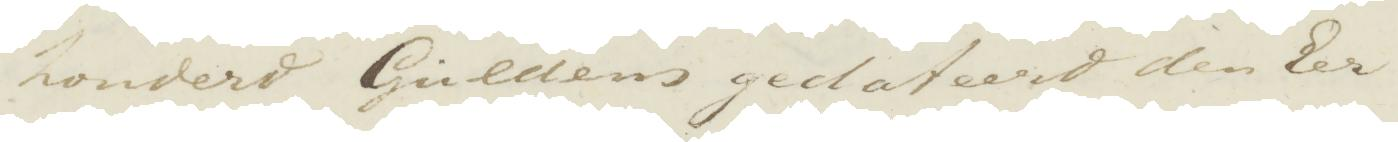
honderd Guldens gedateerd den Eer
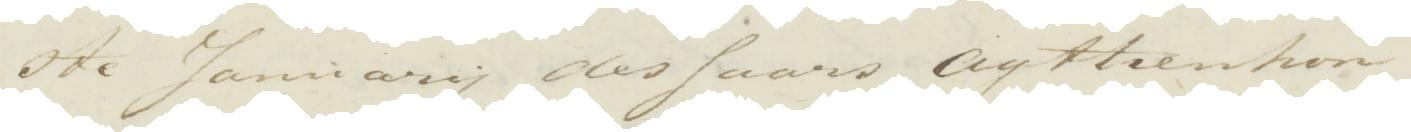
ste Januarij des Jaars Agttienhon
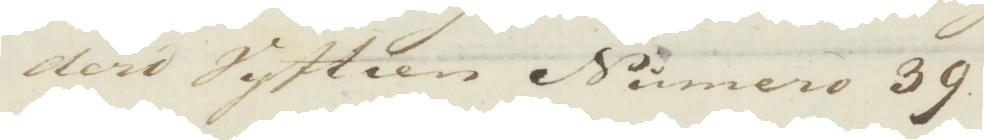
derd Vyftien Numero 39
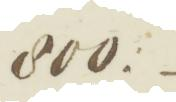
800. _
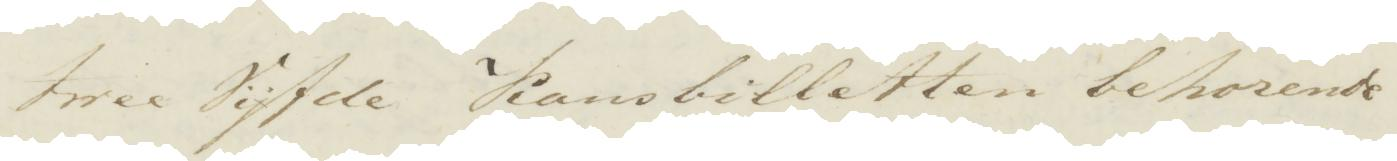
twee Vijfde Kansbilletten behorende
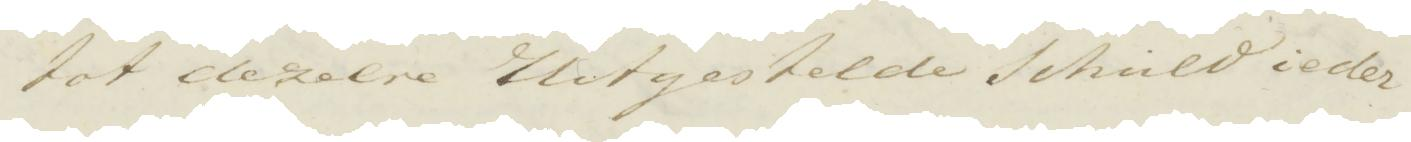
tot dezelve Uitgestelde schuld ieder
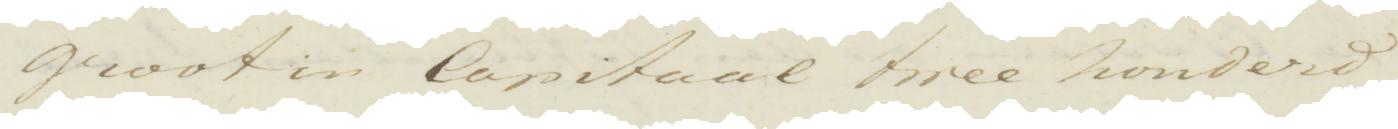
groot in Capitaal twee honderd
